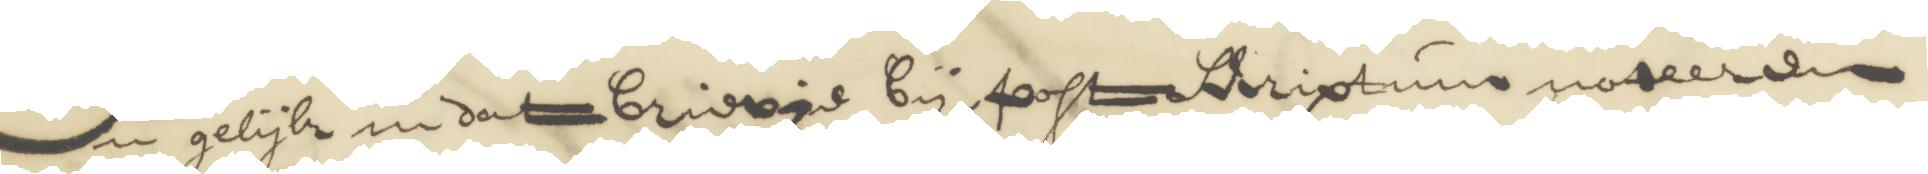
En gelijk in dat brievje bij post scriptum noteeren
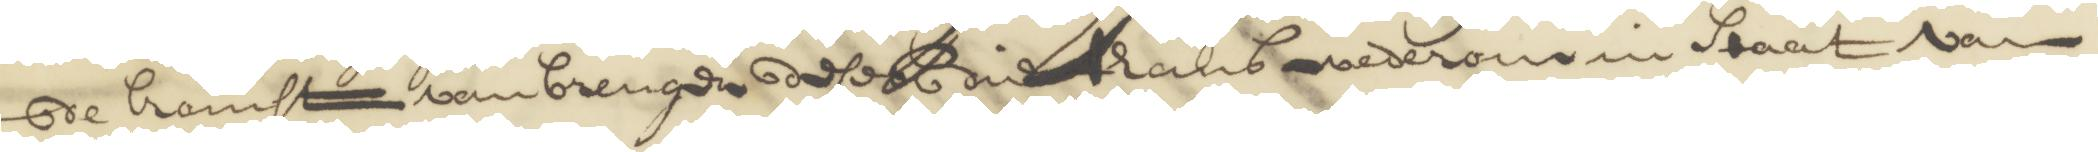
de komst van brenger deses die thans wederom in staat van
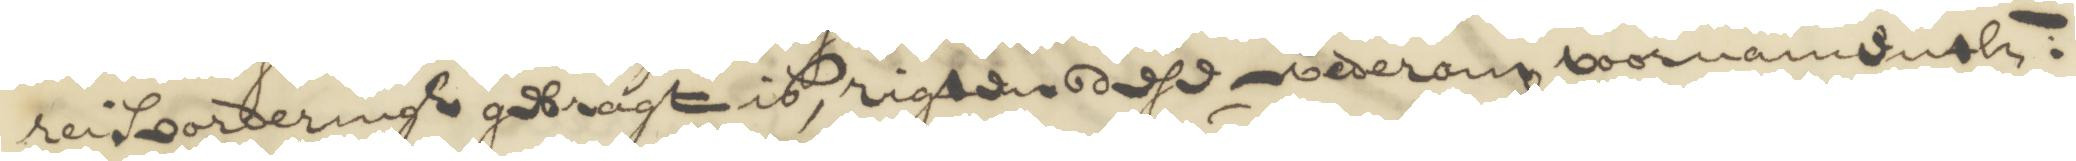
reisvorderingh gebragt is, rigten dese wederom voornamentlijk
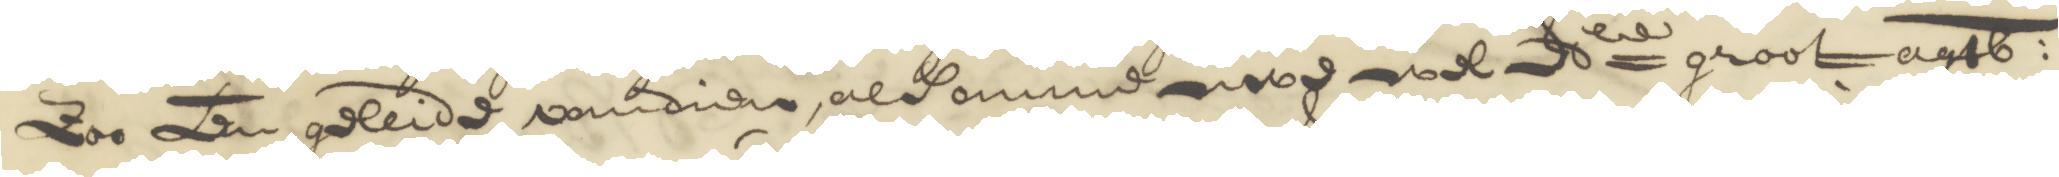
zoo ten geleide vandien, als omme uwe wel Ed=le groot agtb:
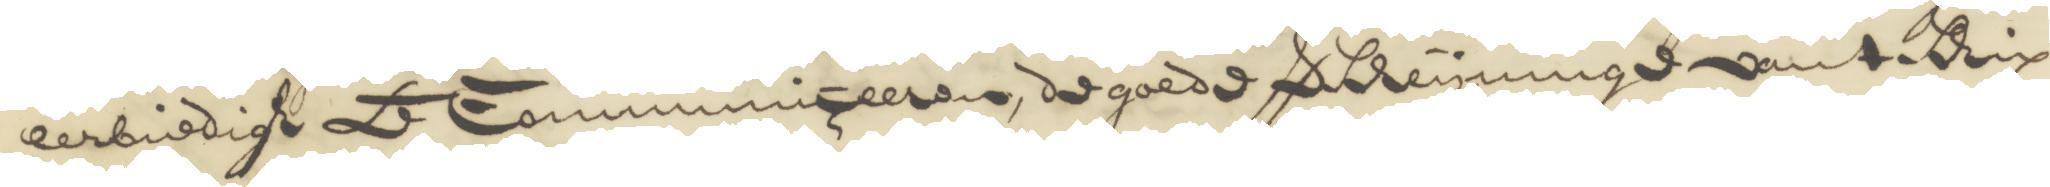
eerbiedigh te Communiçeeren, de goede verschijninge van’t schip
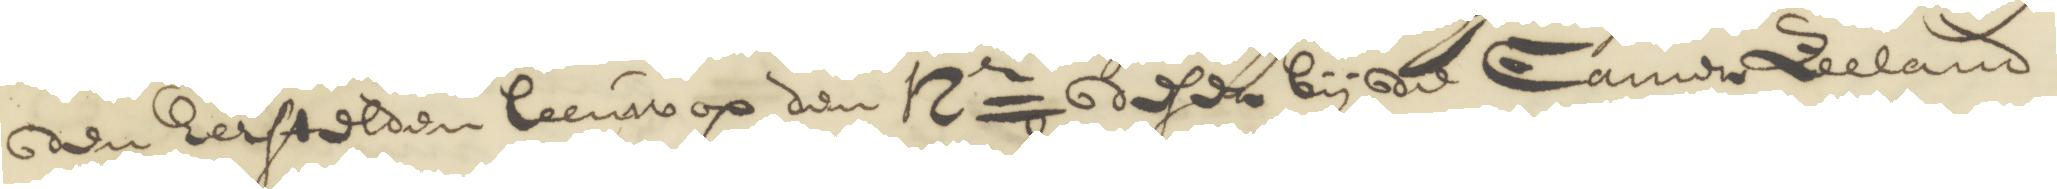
den herstelden leeuw op den 12=en deser bij de Camer zeeland
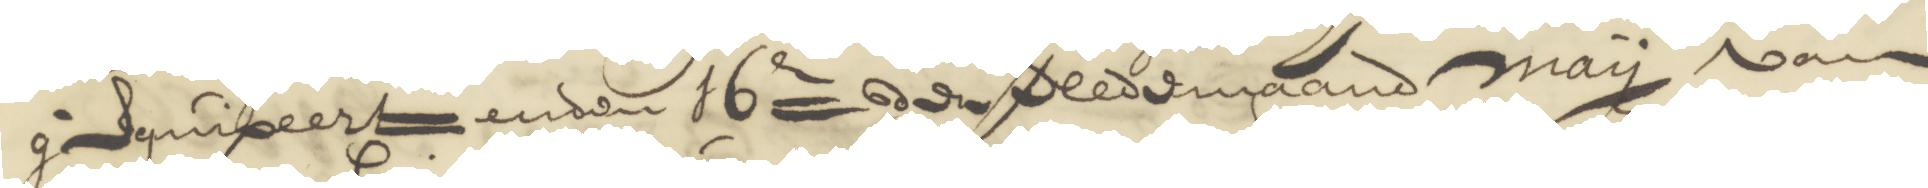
g’Equipeert en den 16=en der verlede maand maij van
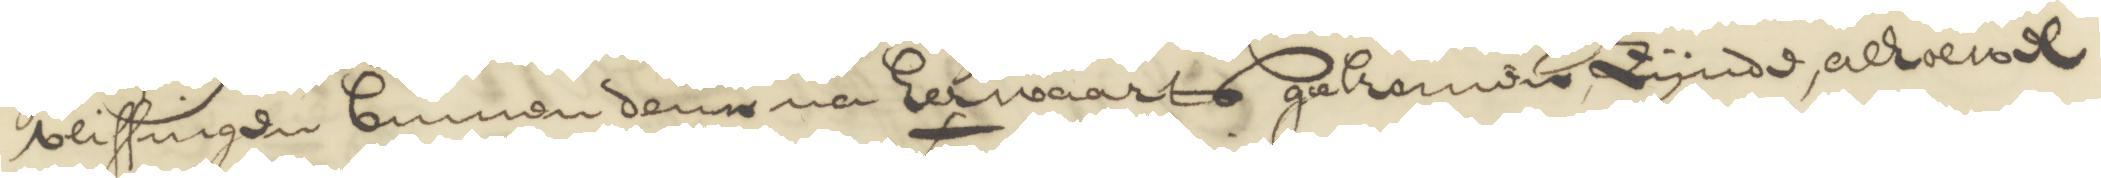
vlissingen binnen deur na herwaarts gekomen zijnde, alhoewel
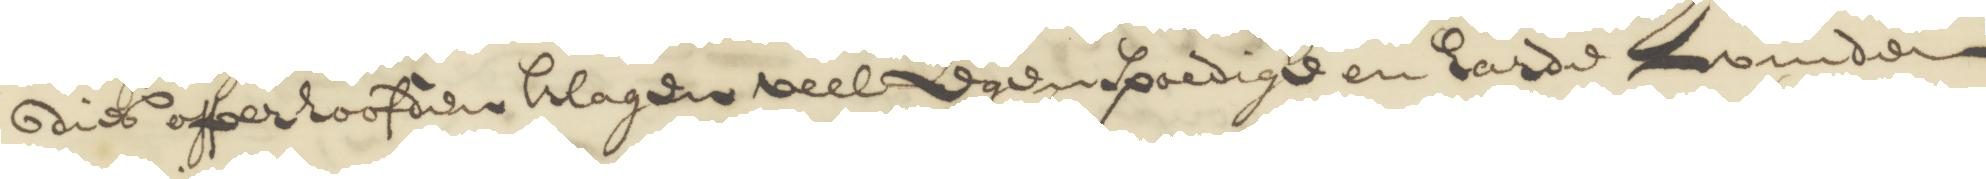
dies opperhoofden klagen veel tegen spoedige en harde winden
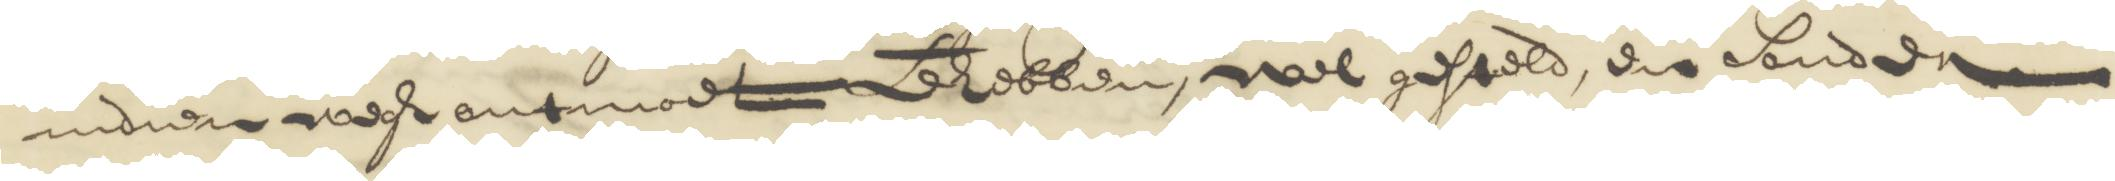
indien wegh ontmoet te hebben, wel gesteld, en sonder
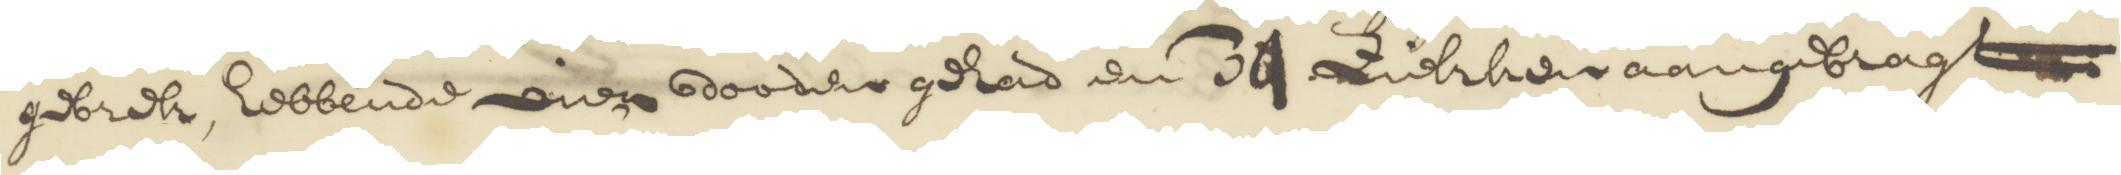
gebrek, hebbende vier dooden gehad en 34 ziekken aangebragt
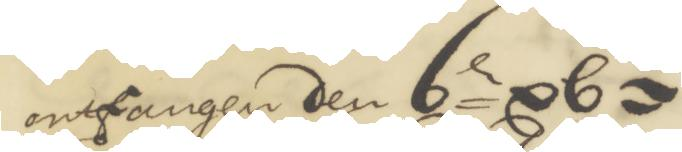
ontfangen den 6=en xb=r
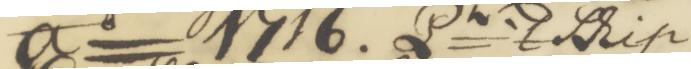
a=o 1716. P=r 't schip
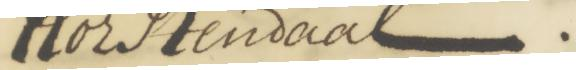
horstendaal.
